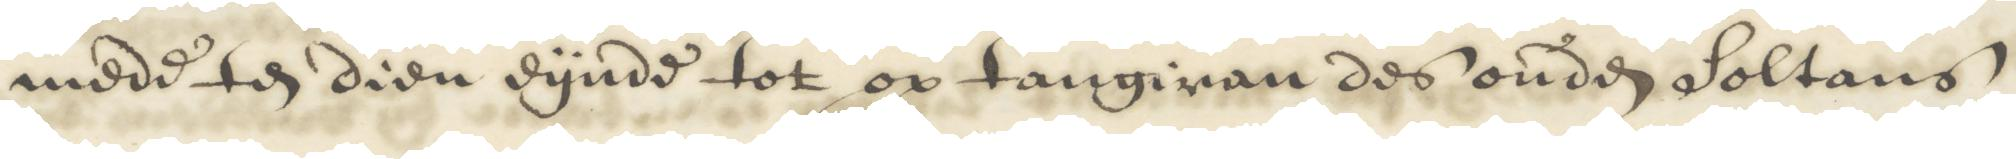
mede ten dien eijnde tot op tangiran des ouden soltans
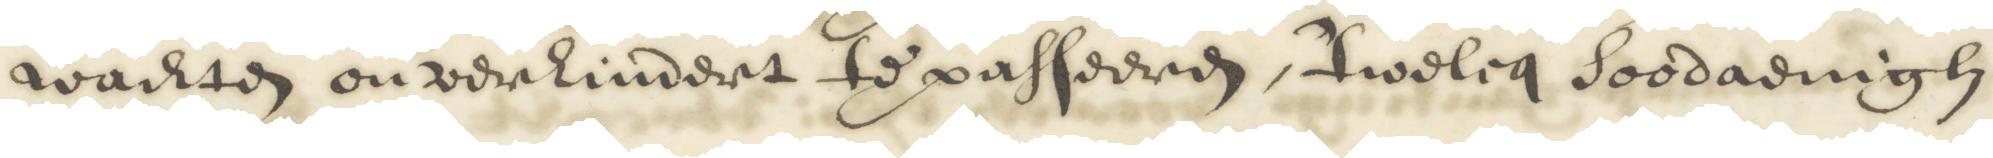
wachten onverhindert te passeeren, 'twelcq soodaenigh
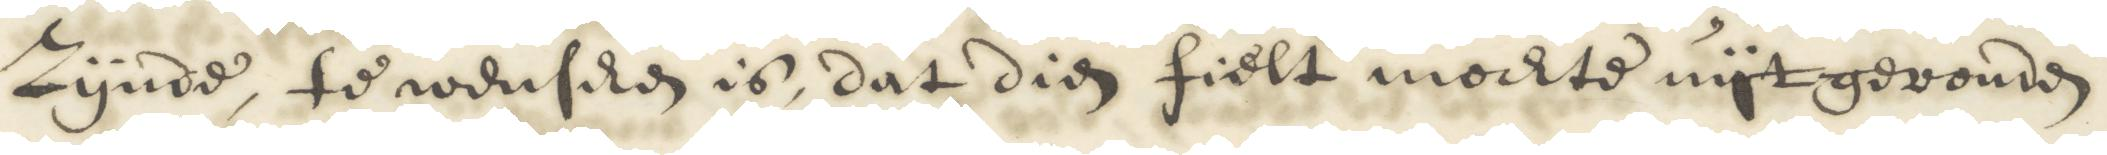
zijnde, te wenschen is, dat dien fielt mochte uijtgevonden
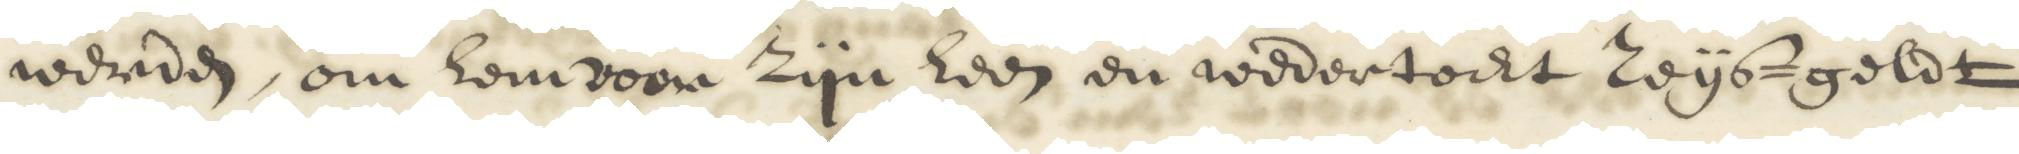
werden, om hem voor zijn heen en wedertocht reijs=geldt
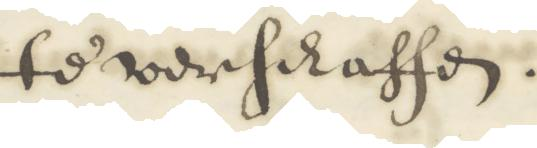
te verschaffen.
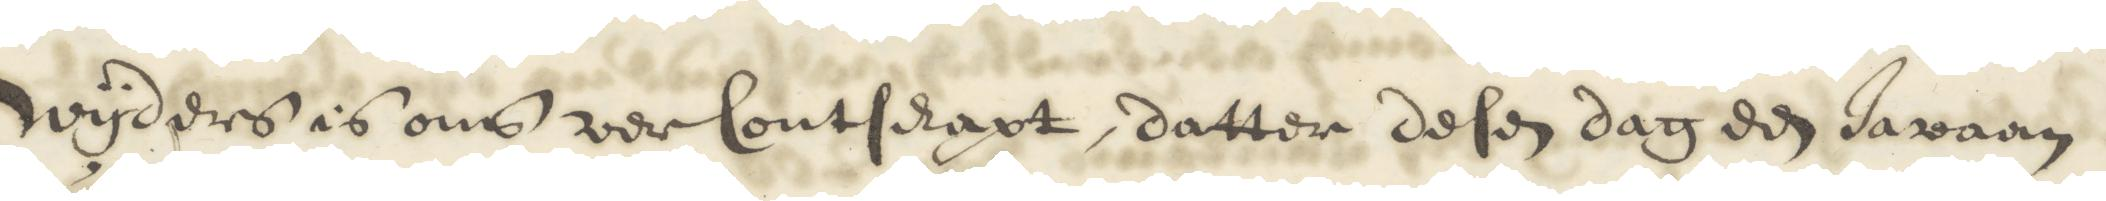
wijders is ons versontschapt, datter desen dag een Javaan
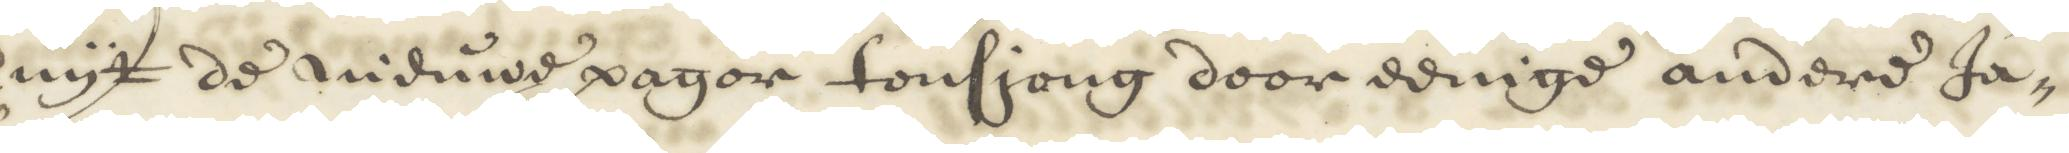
uijt de nieuwe pagor tonsjong door eenige andere Ja„
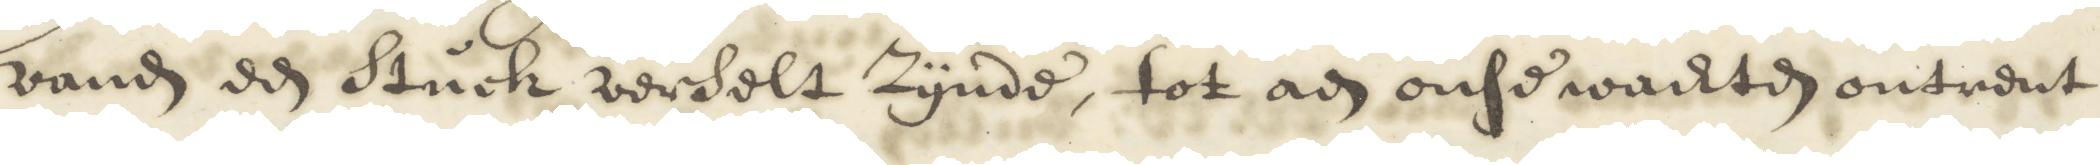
vanen een Stuck verselt zijnde, tot aen onse wachten ontrent
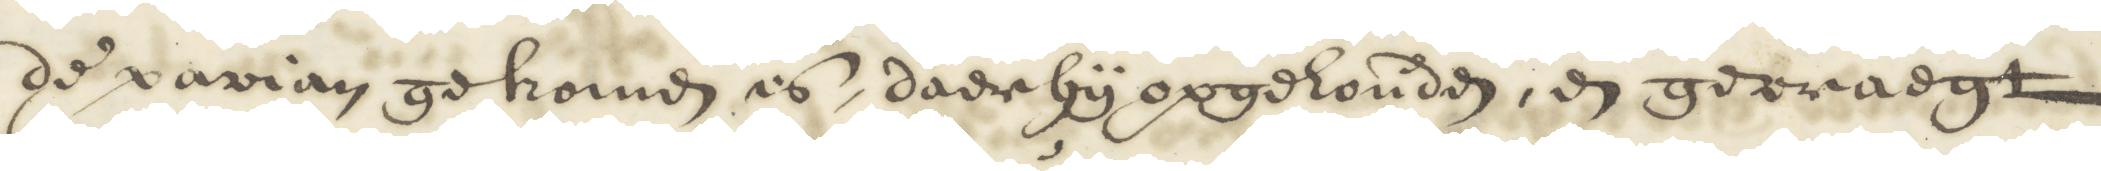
de pavian gekomen is, daerbij opgehouden, en gevraegt
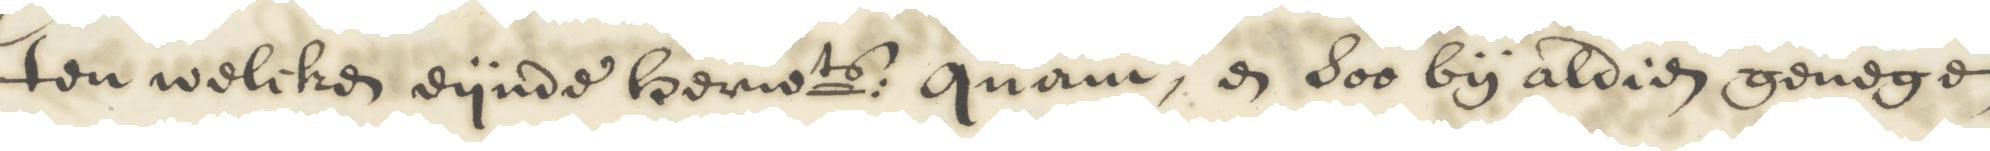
ten welcken eijnde herw=ts quam, en soo bij aldien genege
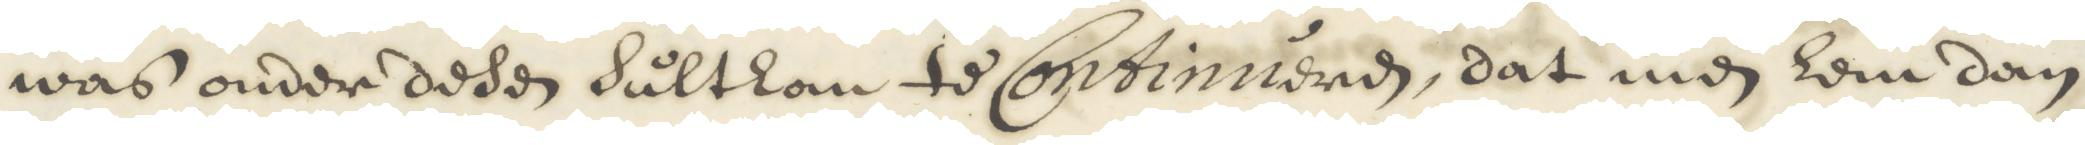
was onder desen sulthan te Continueren, dat men hem dan
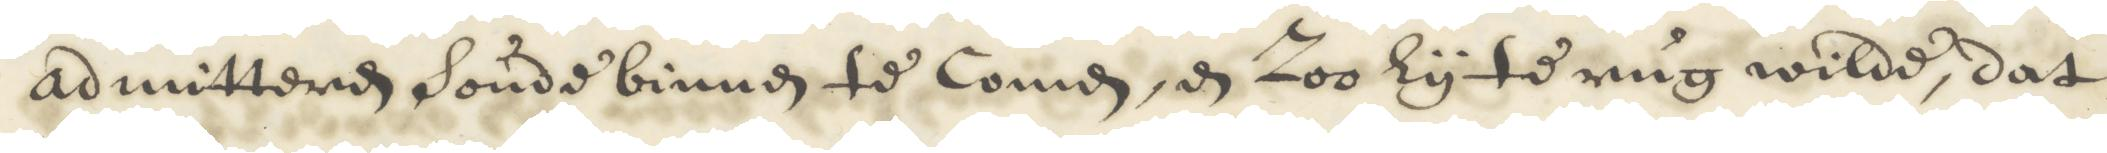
admitteren soude binnen te comen, en zoo hij te rug wilde, dat
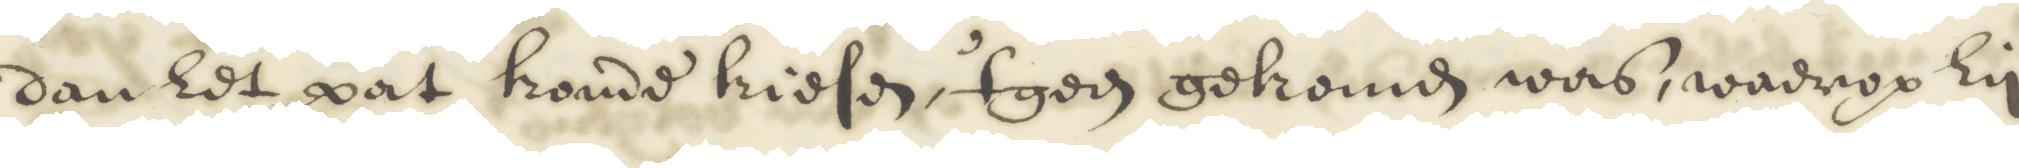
dan het pat konde kiesen, 'tgeen gekomen was, waerop hij
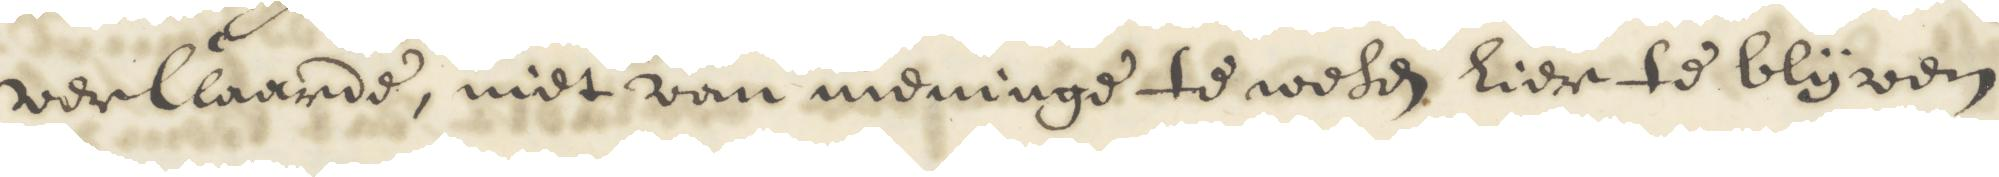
verklaarde, niet van meninge te wesen hier te blijven
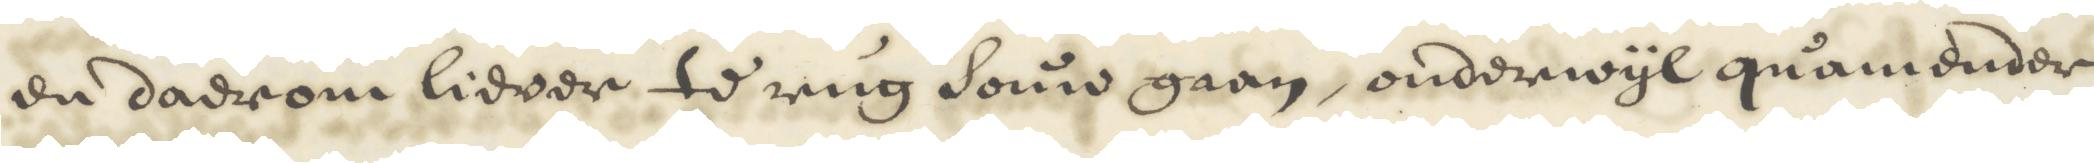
en daerom liever te rug soue gaan, onderwijl quamender
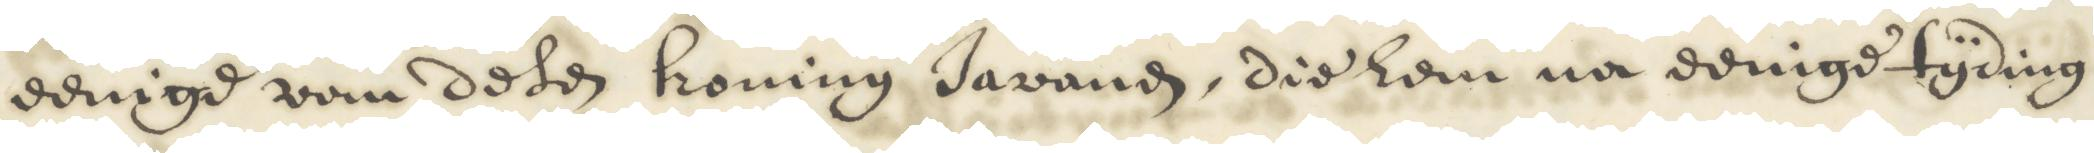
eenige van desen koning Javanen, die hem ne eenige tijding
